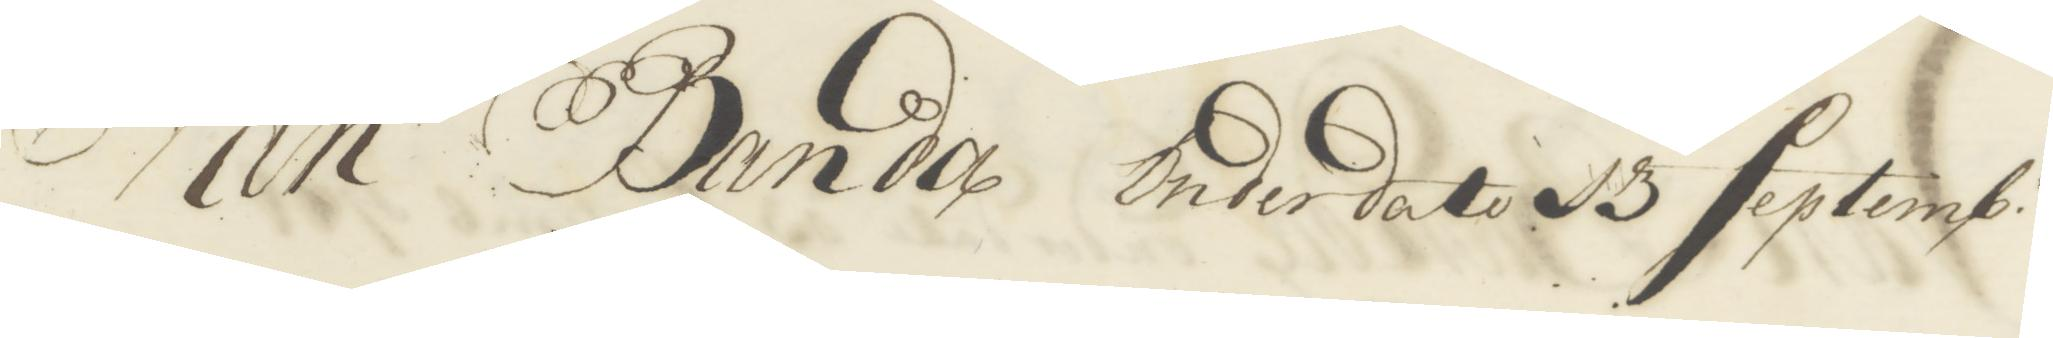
Van Banda Onder dato 13 septemb:
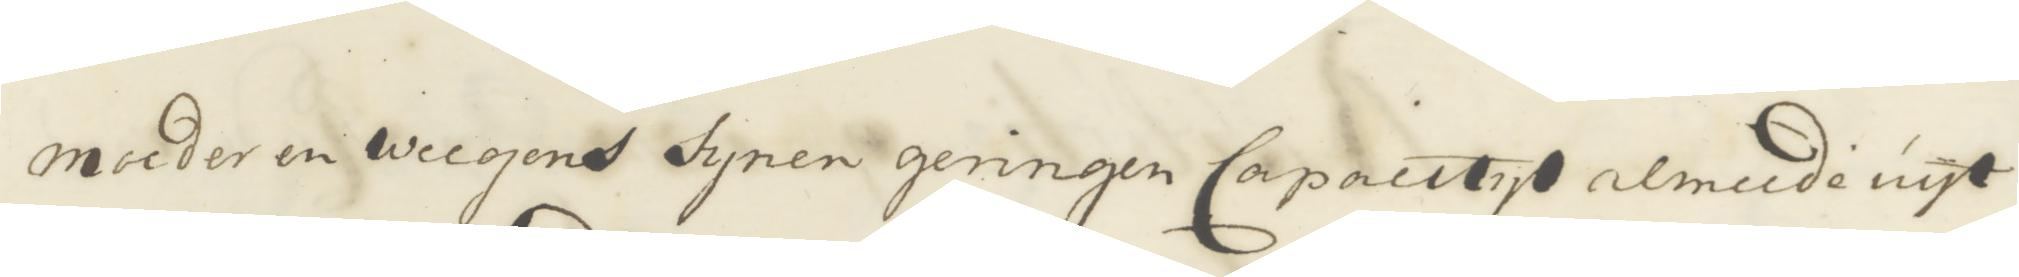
moeder en weegens synen geringen capacitijt almeede uijt
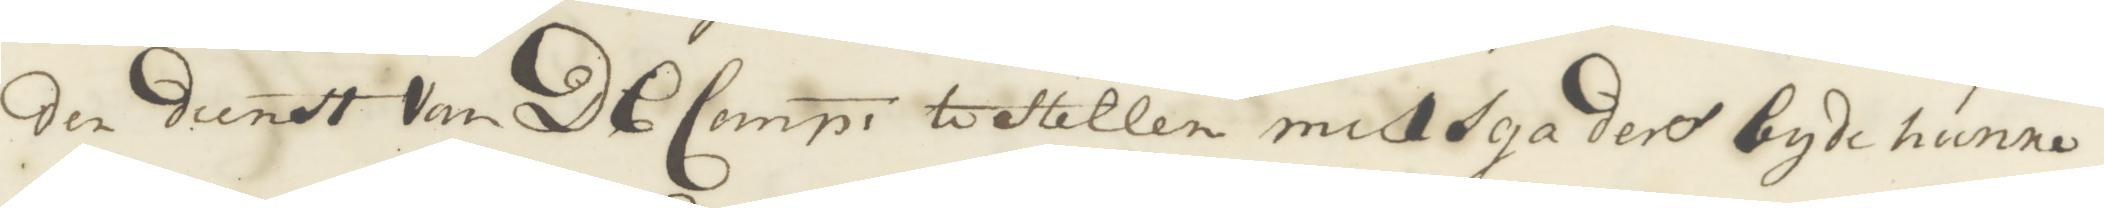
den dienst van D C Comp: te stellen mitsgaders bij de hunne
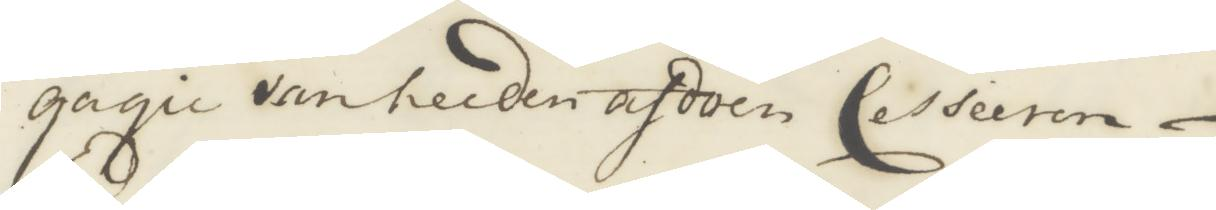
gagie van heeden afdoen cesseeren -
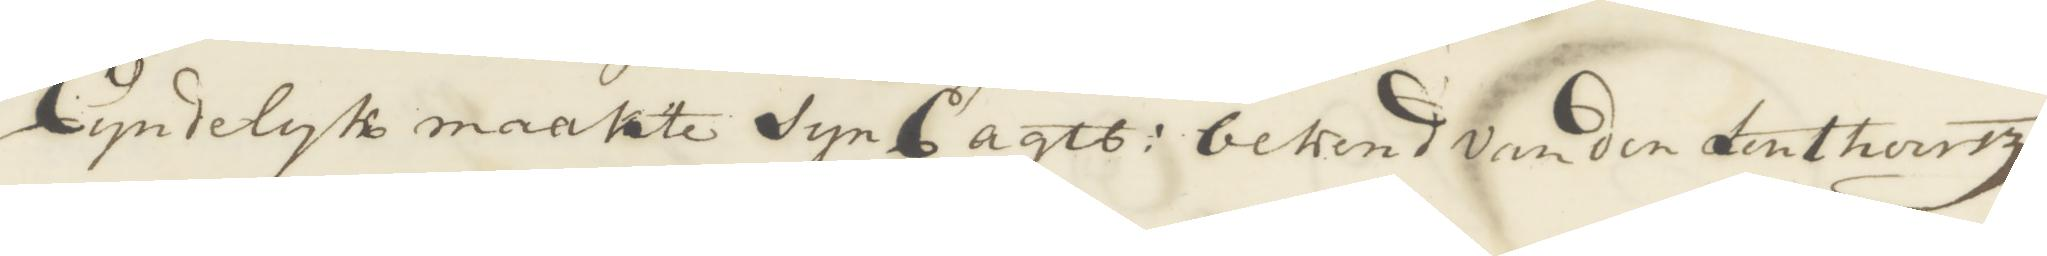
Eijndelijk maakte sijn E agtb: bekend van den senthorstz
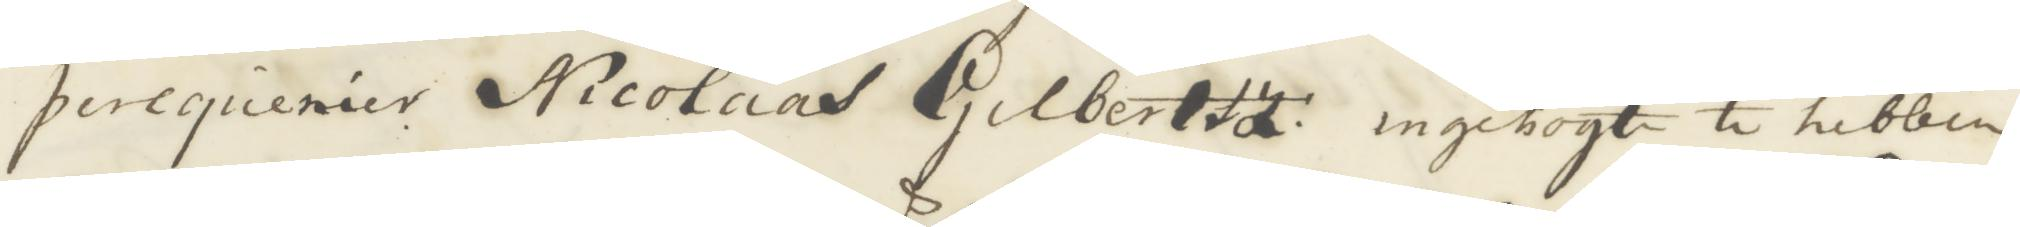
percquenier Nicolaas Gilbertsz: ingekogt te hebben
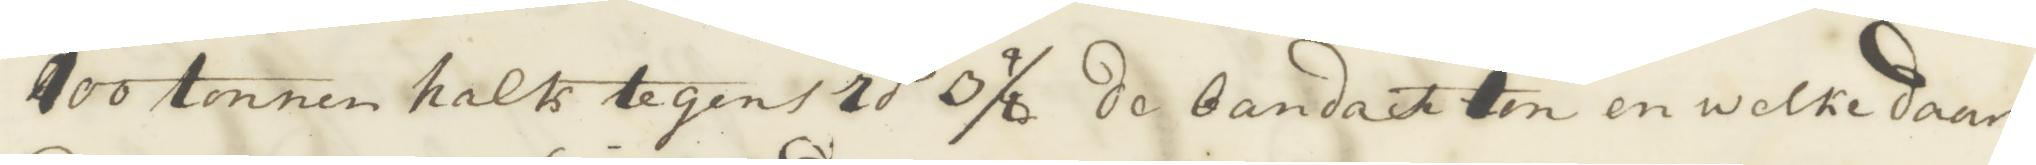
100 tonnen kalk tegens rd 3 4/8 de bandase tin en welke door
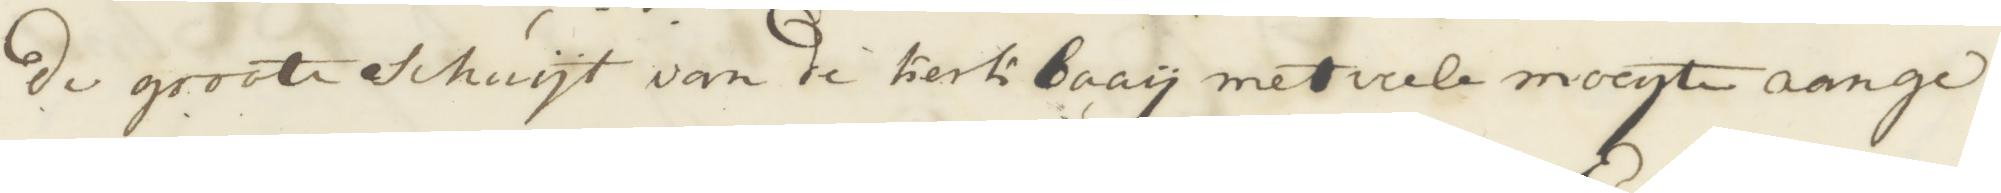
de groote schuijt van de kerkbaaij met veele moeyte aange
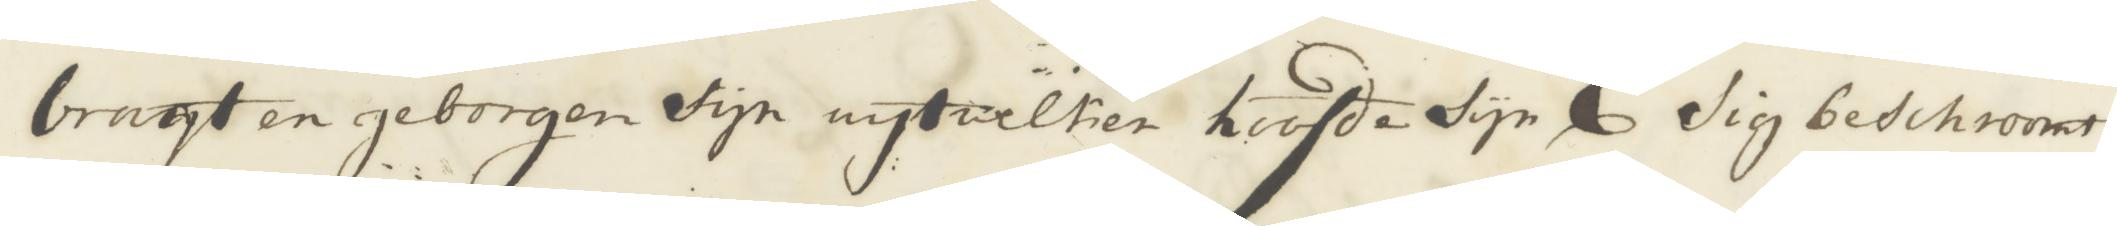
bragt en geborgen sijn uytwelker hoofde sijn E sig beschroomt
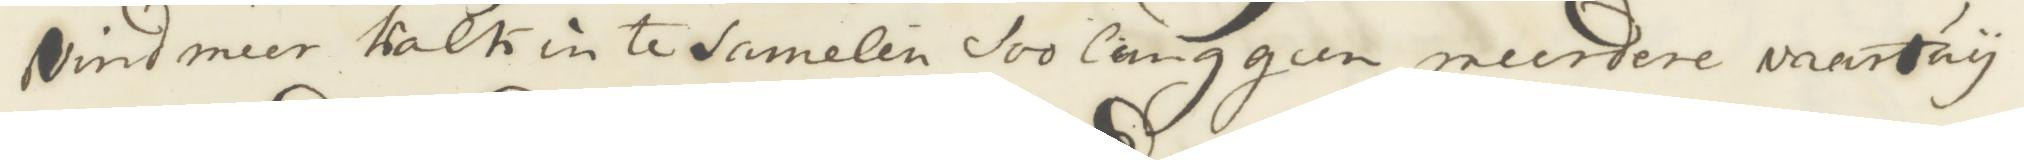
vind meer kalk in te samelen soo lang geen meerdere vaartuij
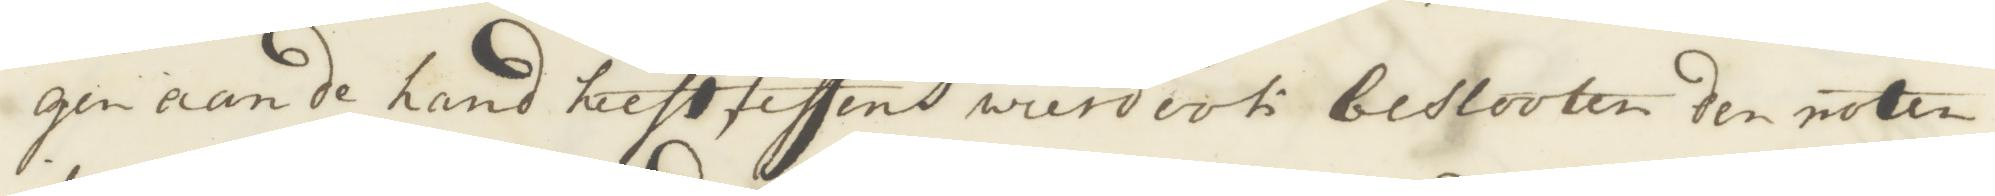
gen aan de hand heeft teffens wierd ook beslooten den noten
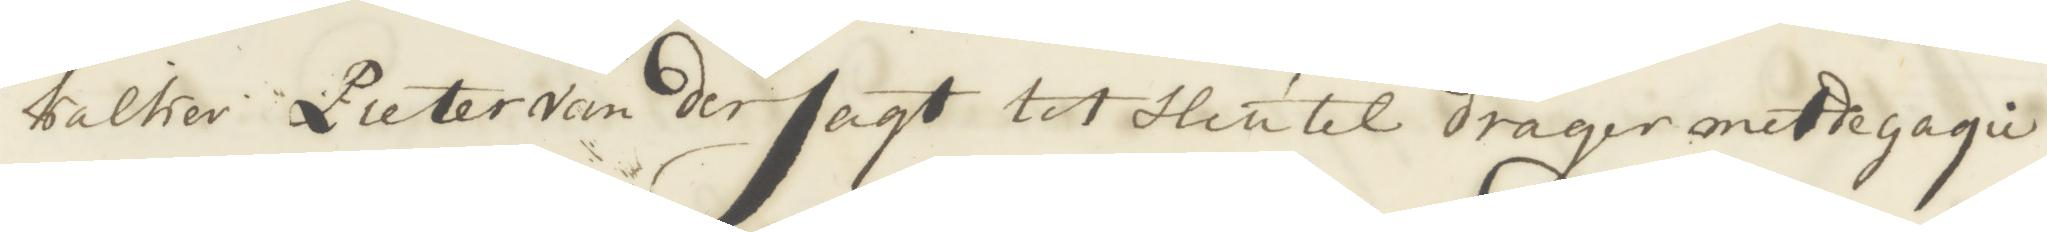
kalker Pieter van der Jagt tot sleutel drager met de gagie
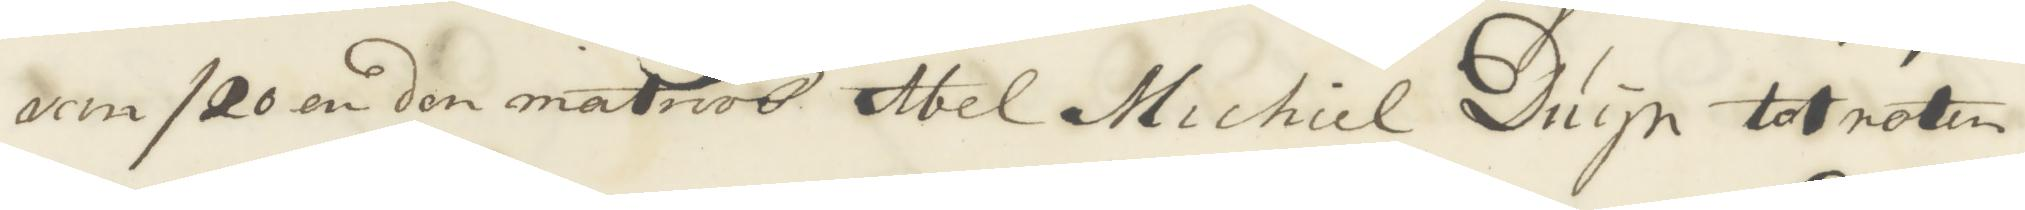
van 120 en den matroos Abel Michiel Duijn tot noten
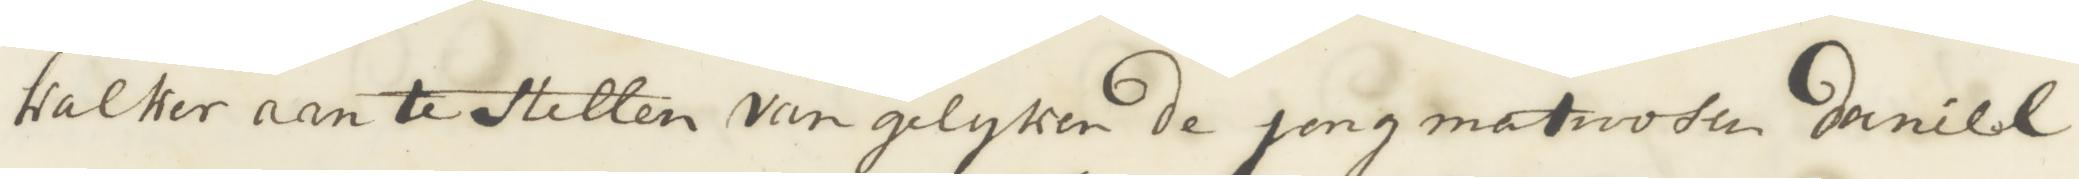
kalker aan te stellen van gelijken de jong matroosen daniel
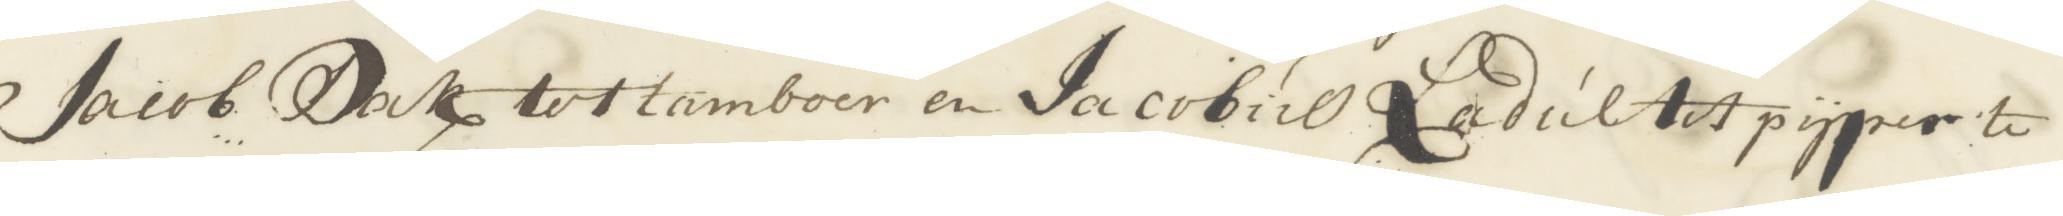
Jacob Dak tot tamboer en Jacobus Ladul tot pijper te
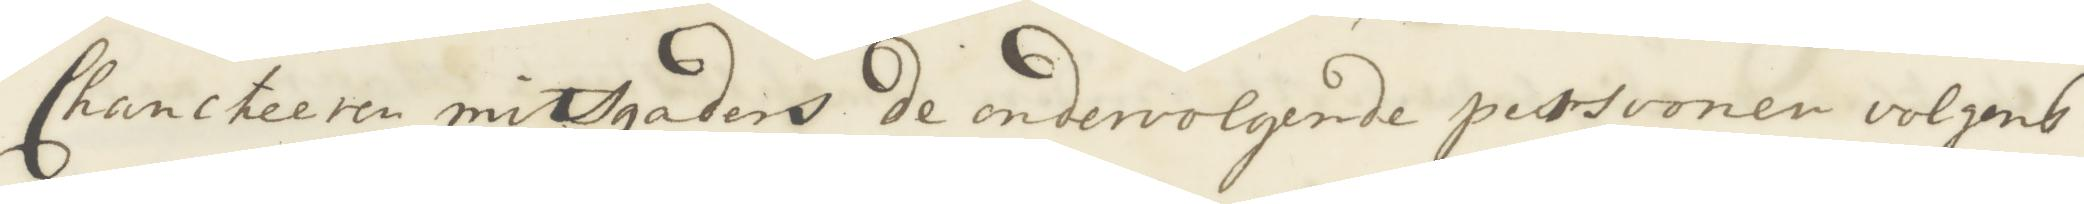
charcheeren mitsgaders de ondervolgende persoonen volgens
